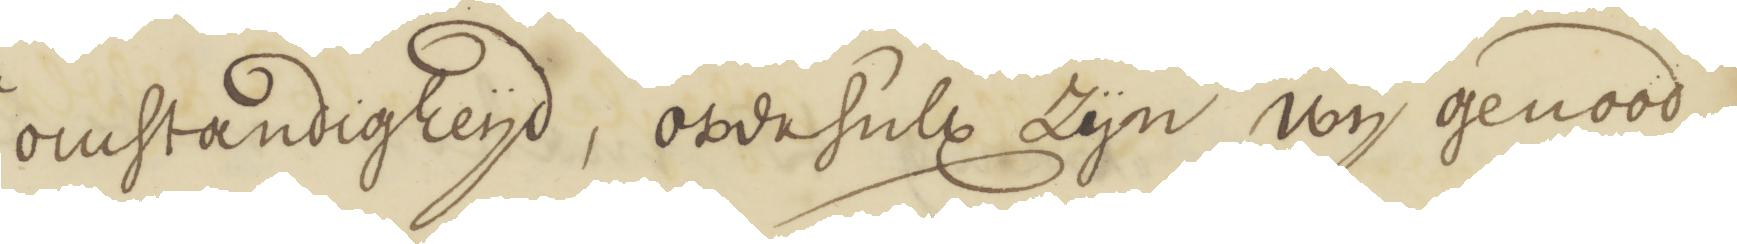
omstandigheijd, oversulx zijn wij genood
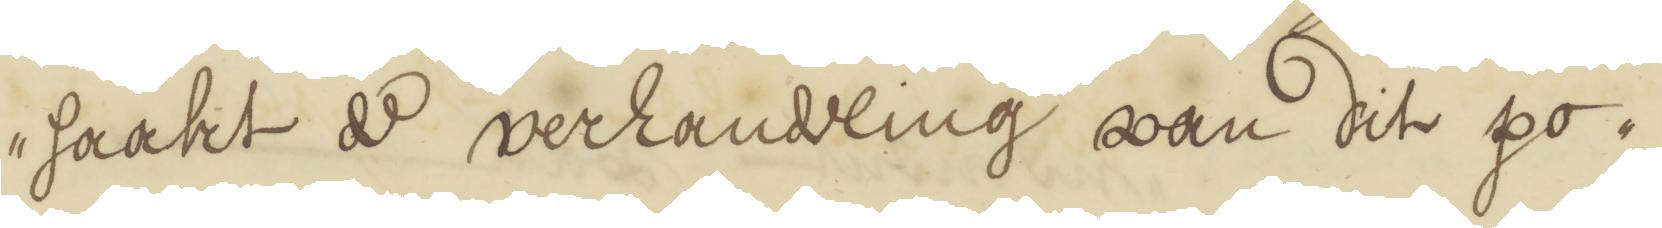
„saakt de verhandeling van dit po„
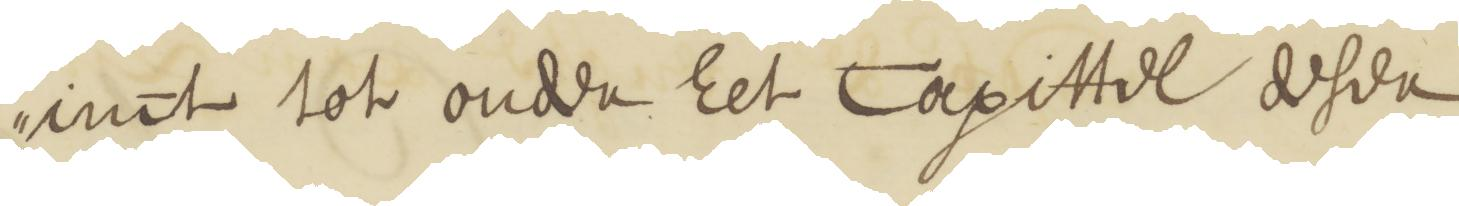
inct tot onder het Capittel deser
